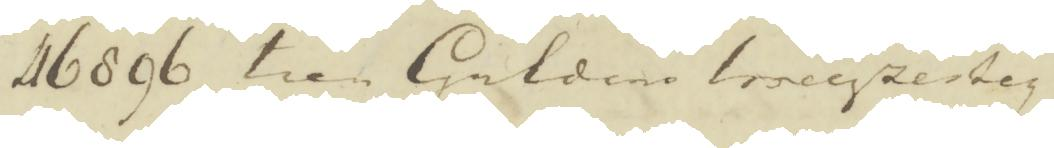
46896 tien Guldens tweeen zestig
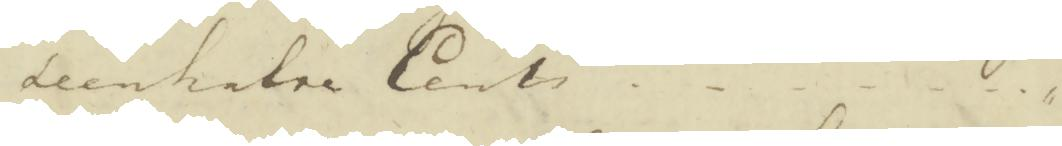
& een halve Cents- - - - - -. „
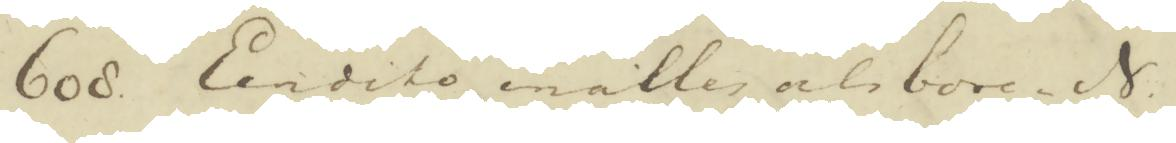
608 Een dito in alles als boven N.
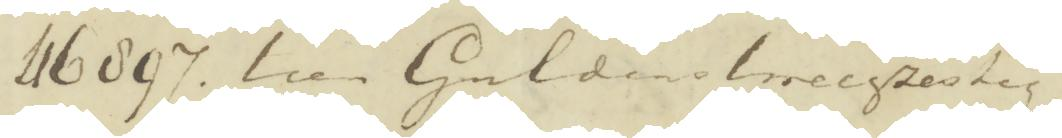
46897. tien Guldens tweeenzestig
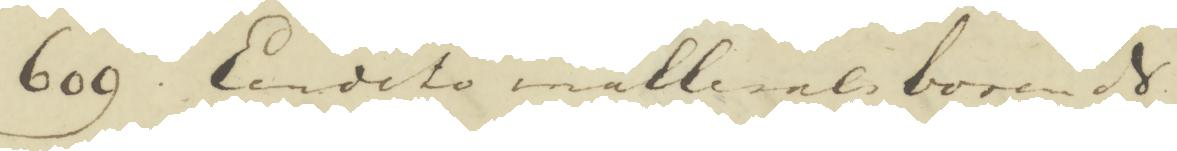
609. Een dito in alles als boven N.
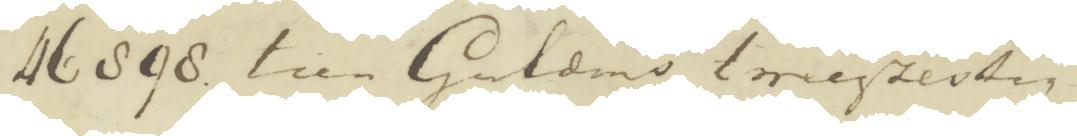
46898 tien Guldens tweeenzestig
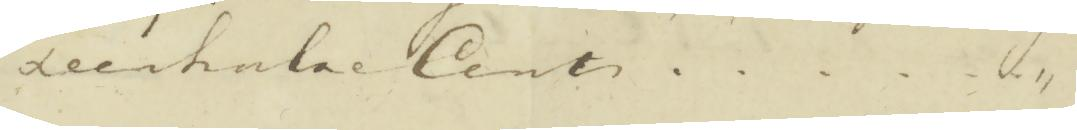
& een halve Cents . . . . . „
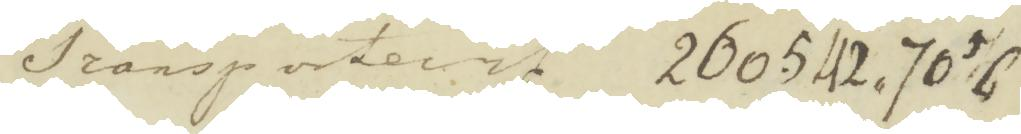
Transporteer ƒ 260.542„70 5/6
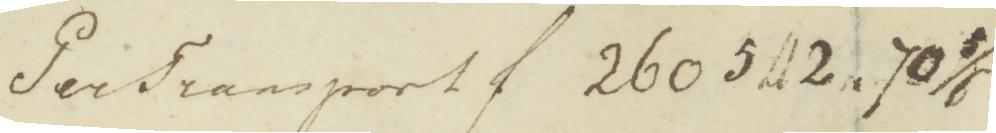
Per Transport ƒ 260 542„70 5/6
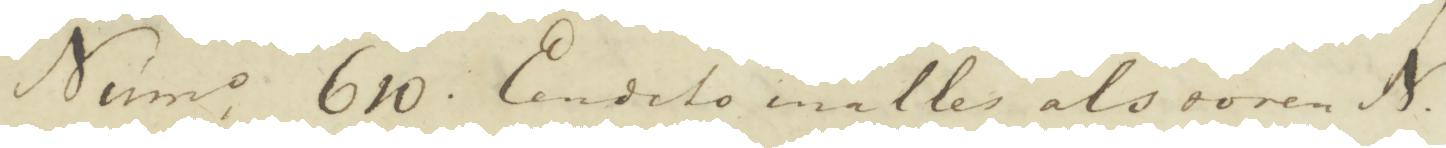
Num:o 610. Een dito in alles als voren N.
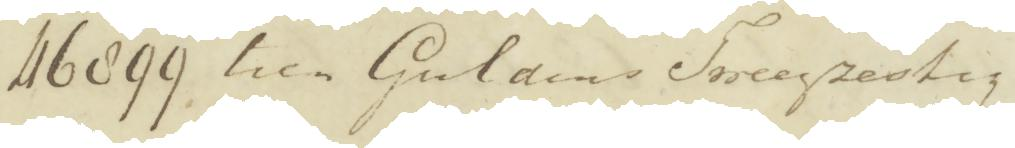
46899 tien Guldens Tweeenzestig
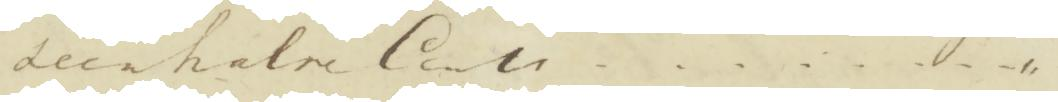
& een halve Cents- - - - - - - - „
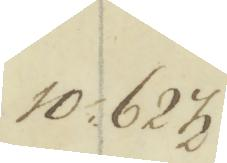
10:62½
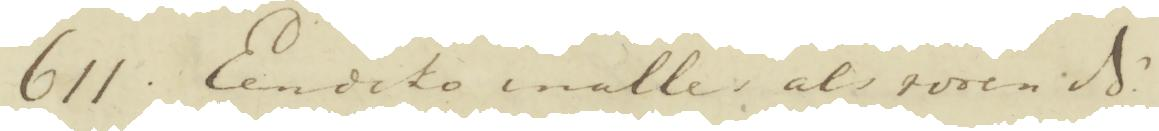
611. Een dito in alles als voren N
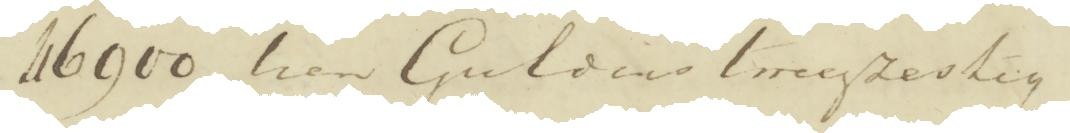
46900 tien Guldens tweeenzestig
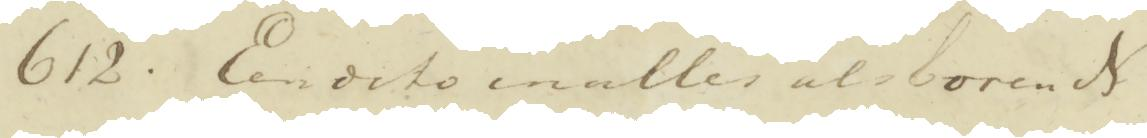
612. Een dito in alles als boven N
